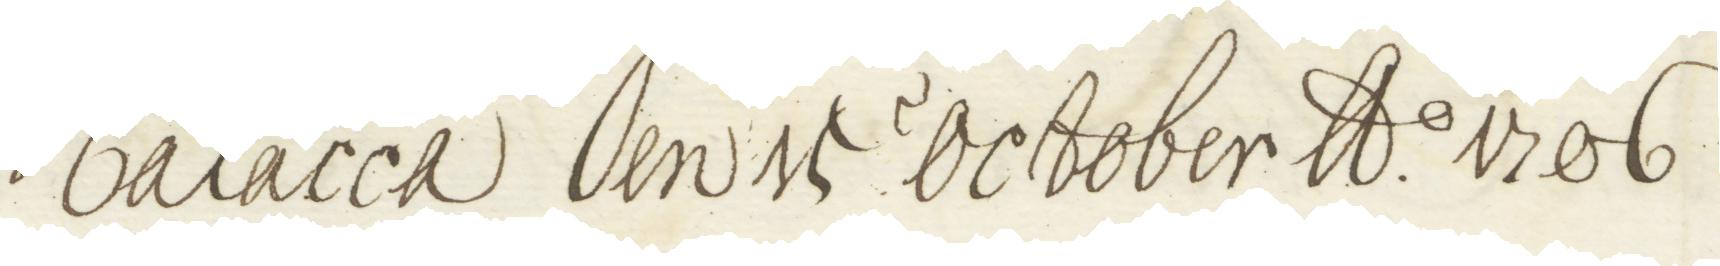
Van Malacca den 15' october A.o 1706
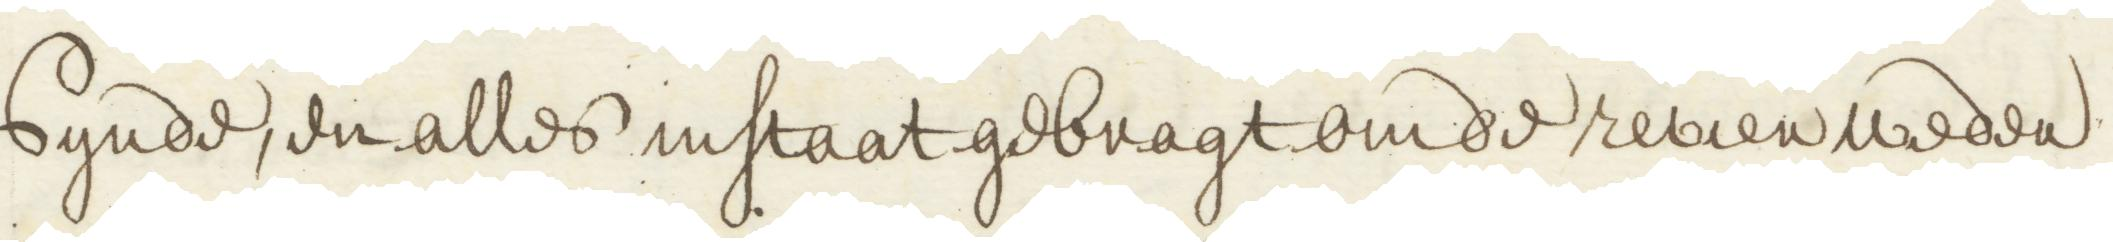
Synde, en alles instaat gebragt om de revier weder
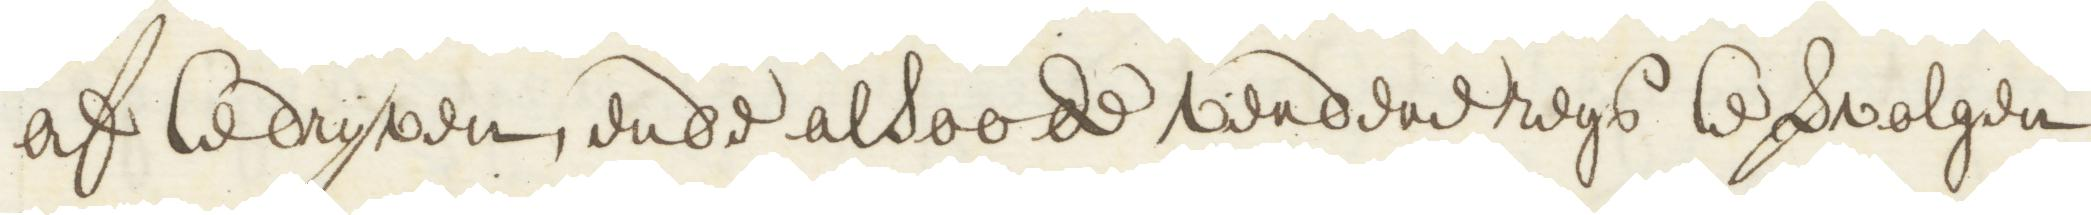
af te drijven, ende alsoo de verdere reys te vervolgen
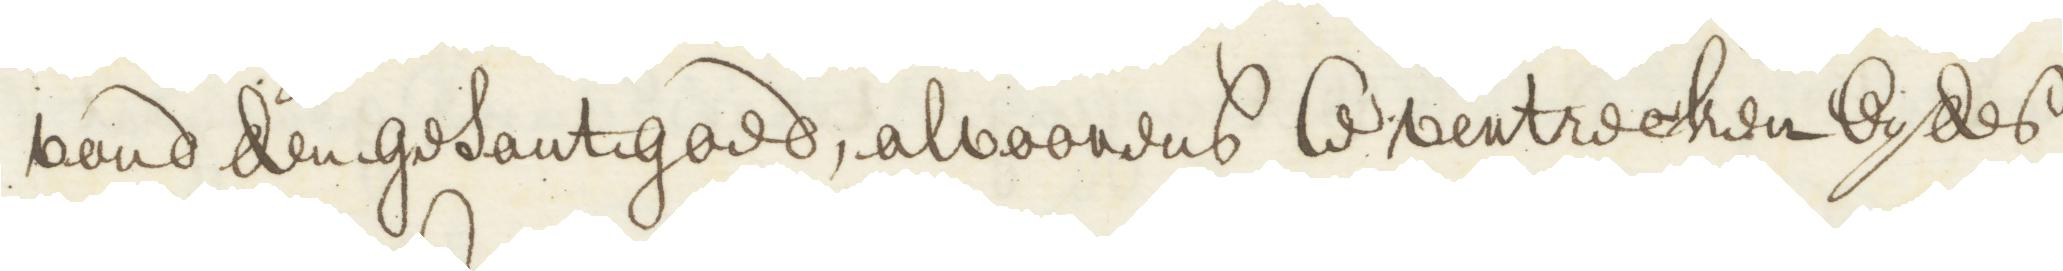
vond den gesant goed, alvoorens te vertrecken bij des
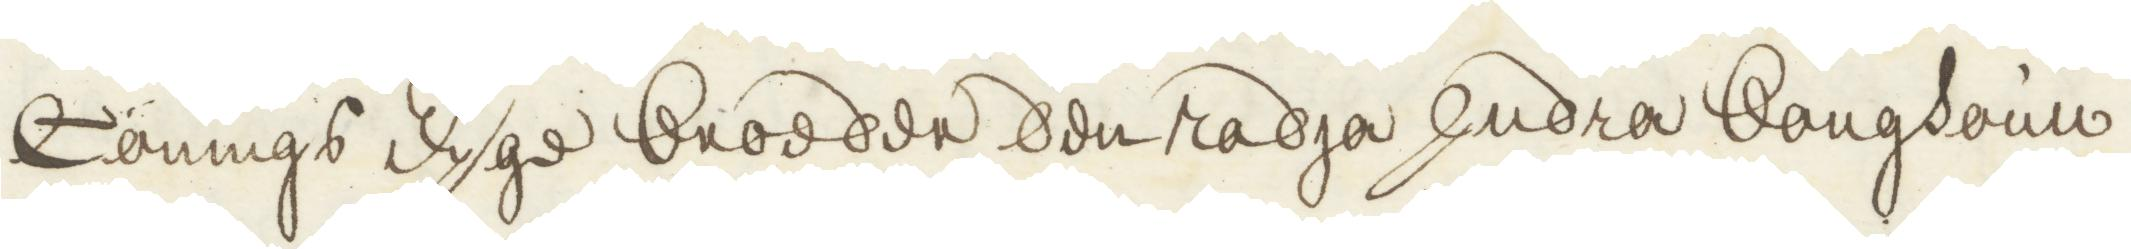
Conings Eyge broeder den radja Jndra bongsouw
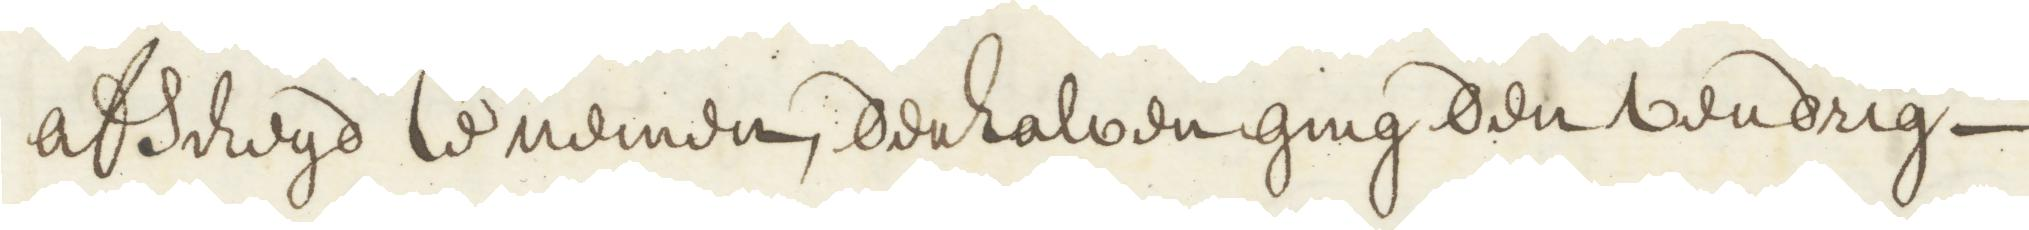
afscheyd te nemen, derhalven ging den vendrig
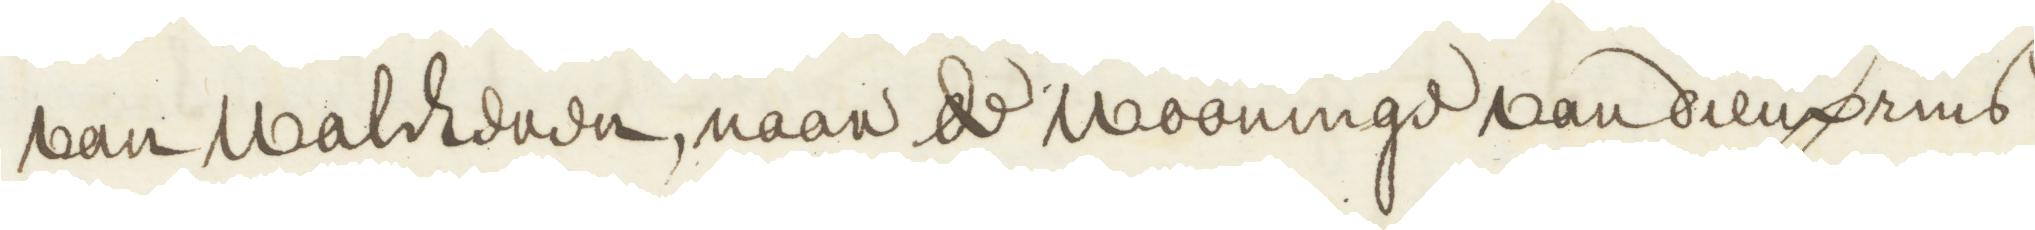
van walcheren, naar de wooninge van den prins
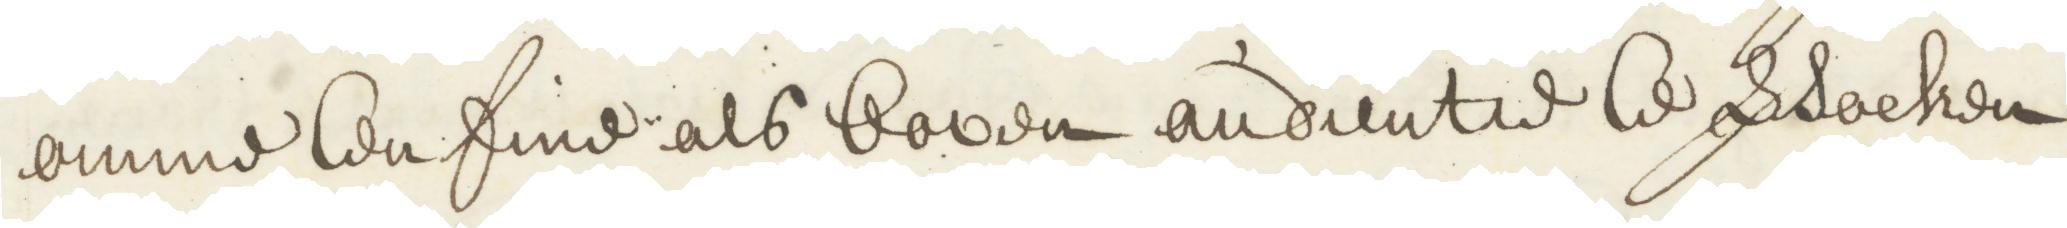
omme ten fine als boven audientie te versoeken
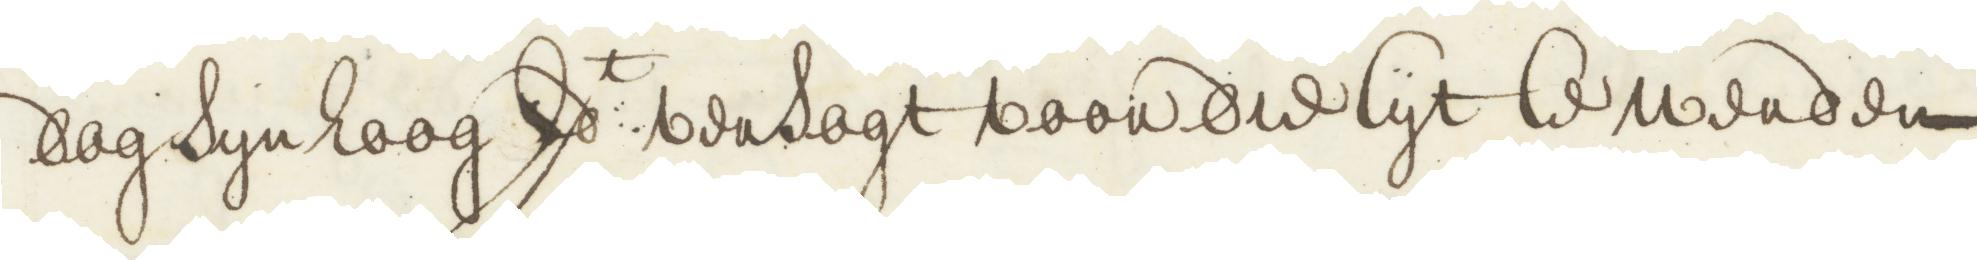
dog sijn hoog Hd:t versogt voor die tijt te werden
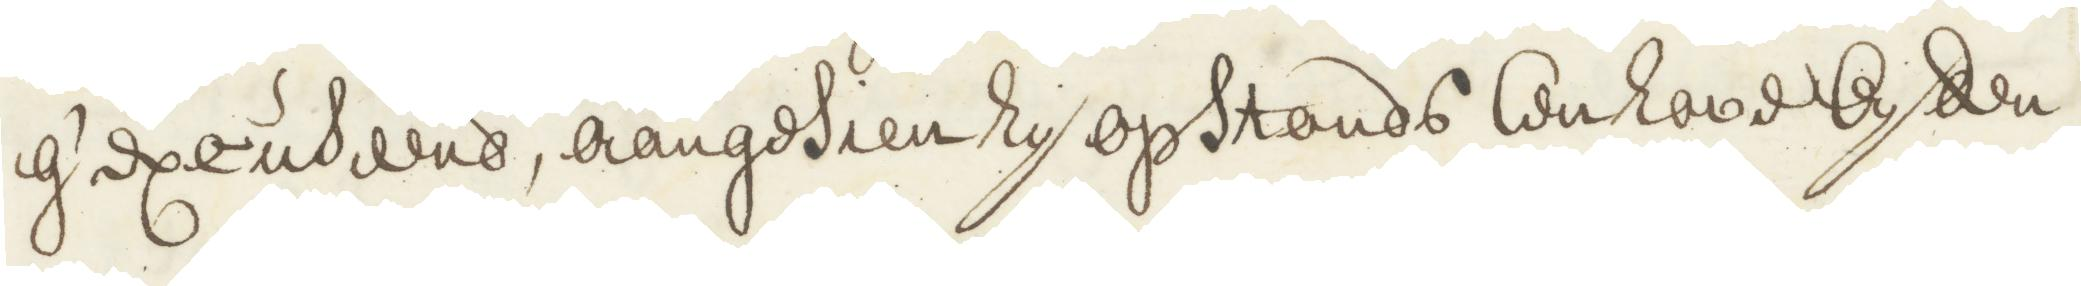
g’excuseerd, aangesien hy opstonds ten hove by den
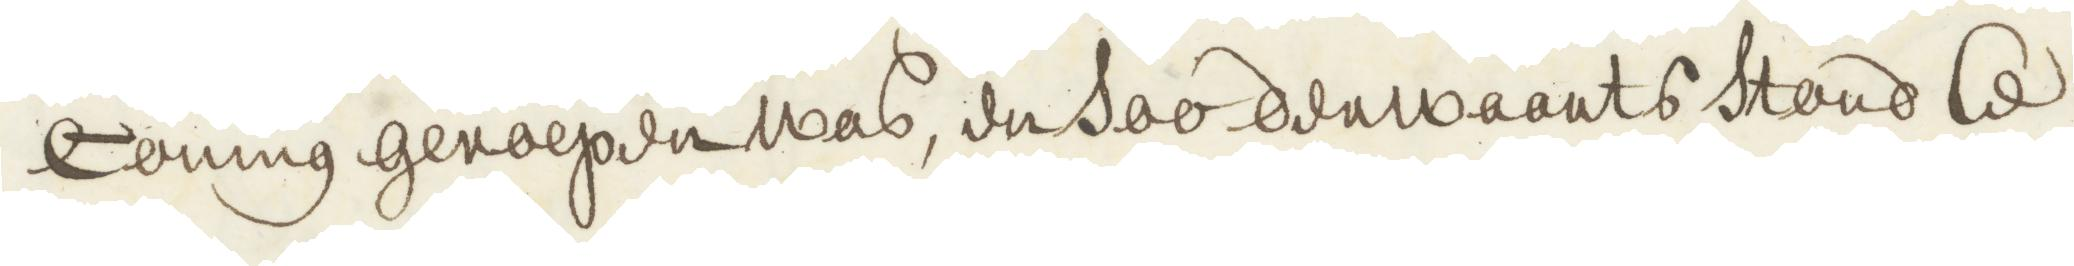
Coning geroepen was, en soo derwaarts stond te
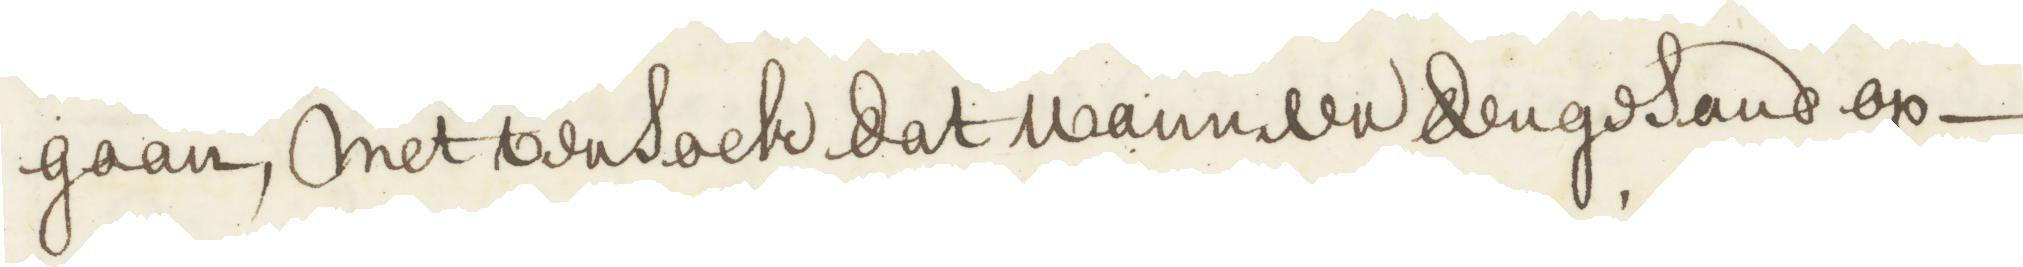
gaan, met versoek, dat wanneer den gesand op
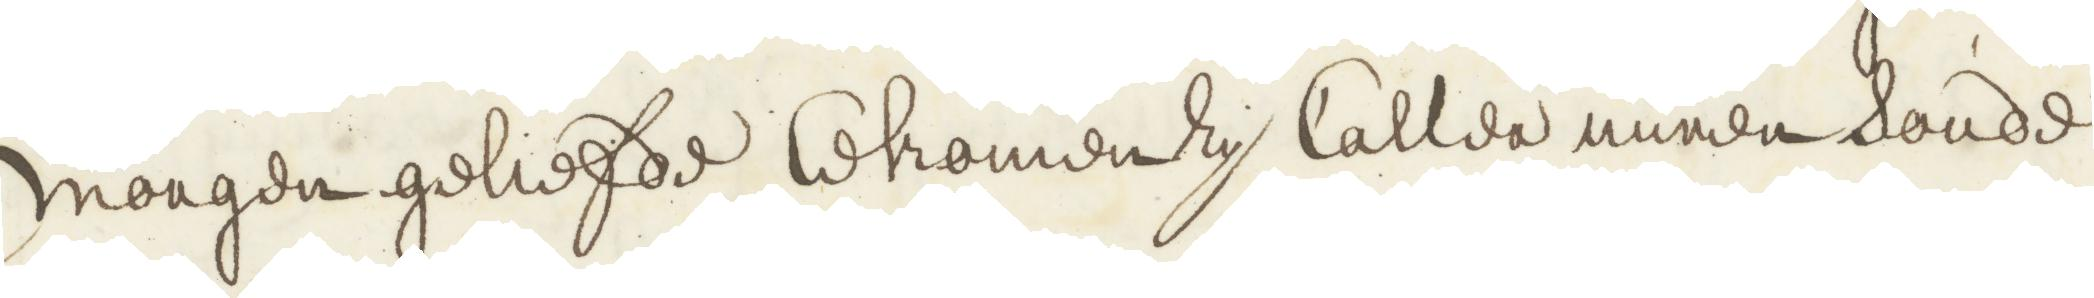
morgen geliefde te komen hij t' aller uuren soude
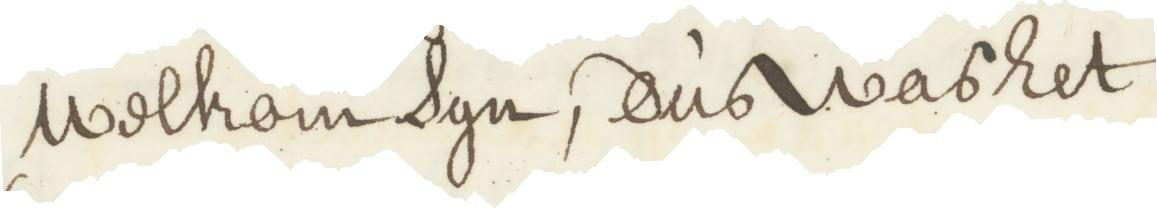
welkom syn, dus was het.
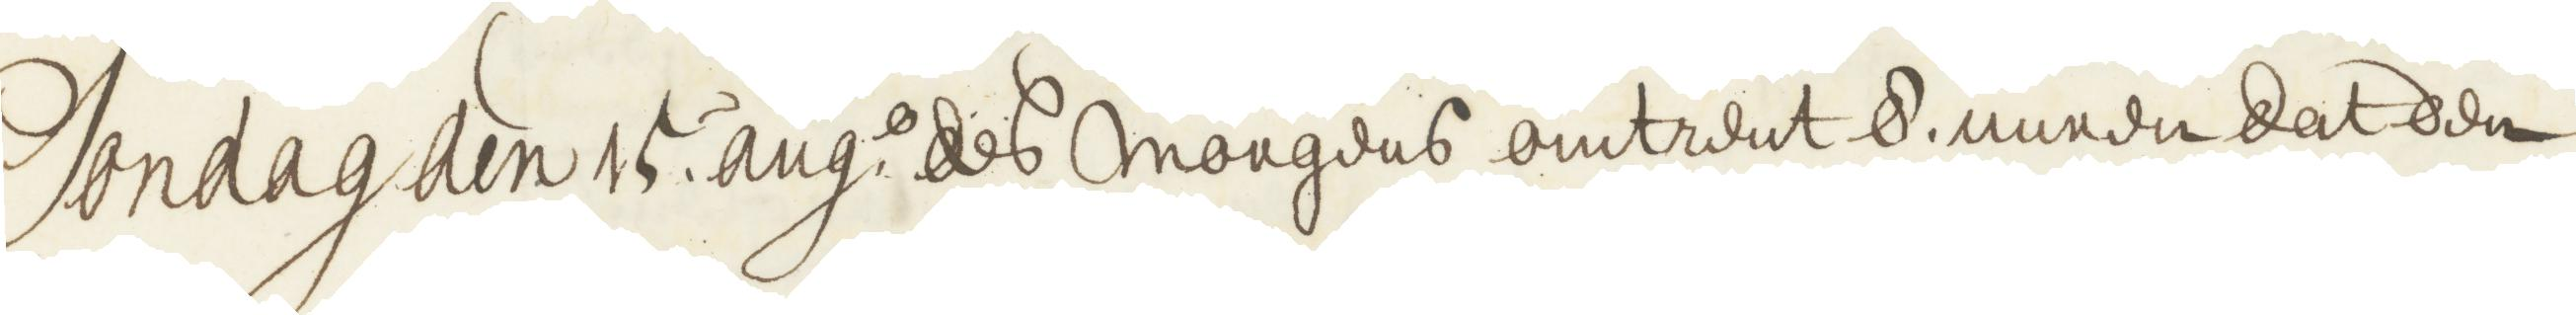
Sondag den 15.' aug.o des morgens omtrent 8. uuren dat den
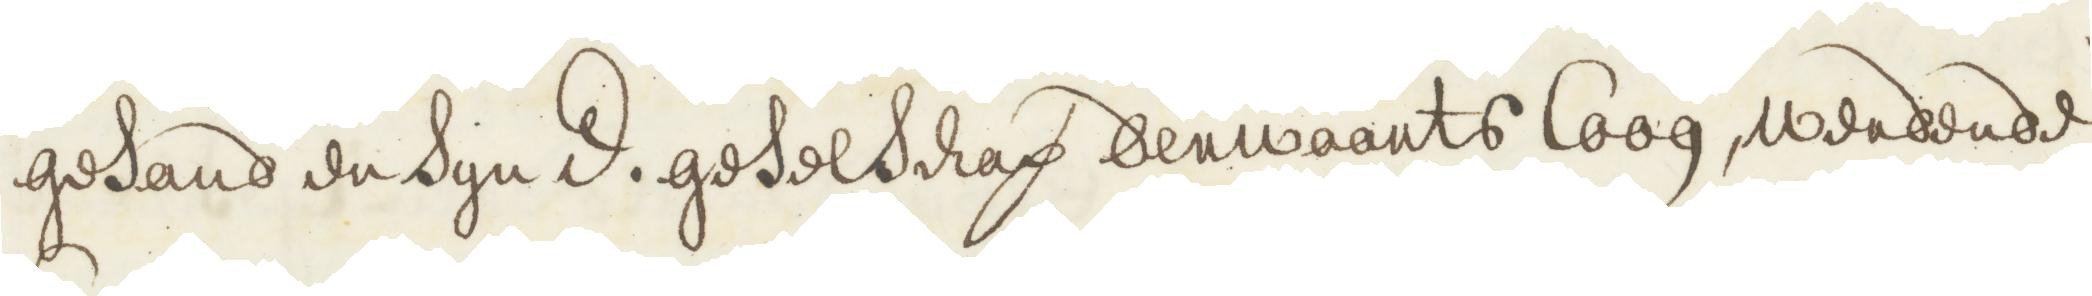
gesand en sijn E. geselschap derwaarts toog, werdende
